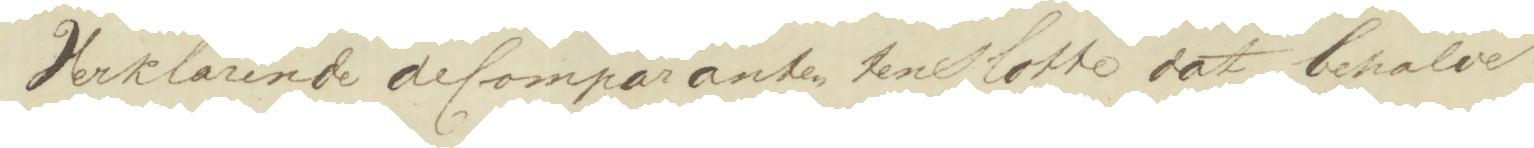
Verklarende de Comparanten tenslotte dat behalve
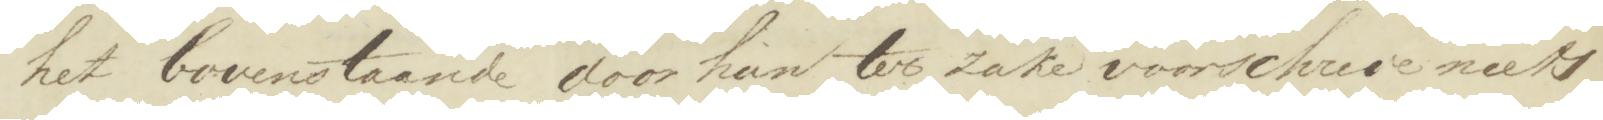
het bovenstaande door hun ter zake voorschreve niets
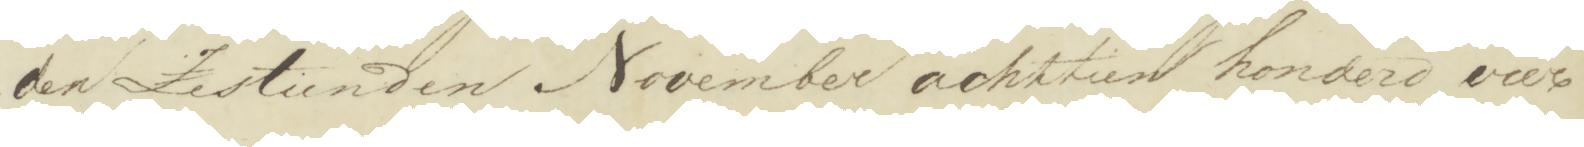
den Zestienden November achttien honderd vier
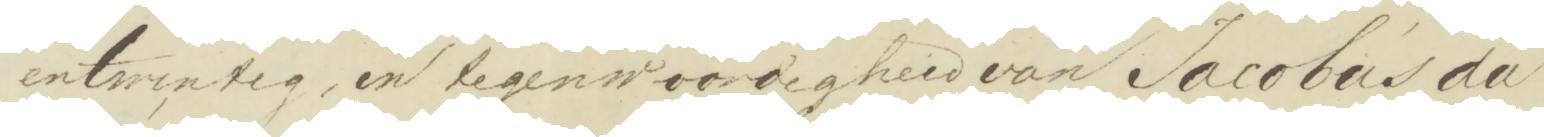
en twintig, in tegenwoordigheid van Jacobus du
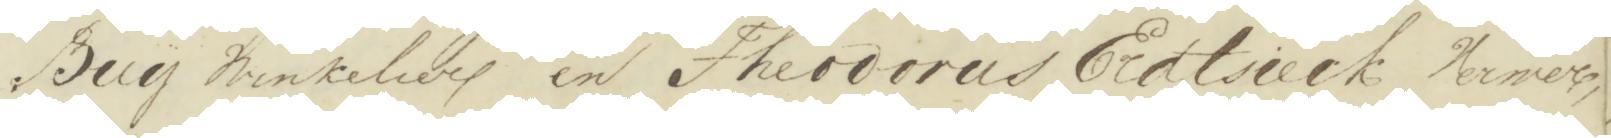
Buij Winkelier en Theodorus Erdtsieck Verwer,
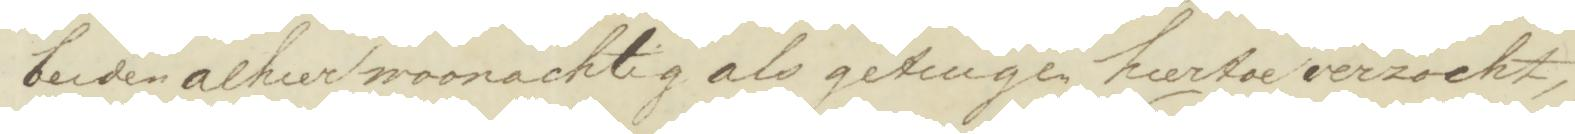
beiden alhier woonachtig als getuigen hiertoe verzocht,
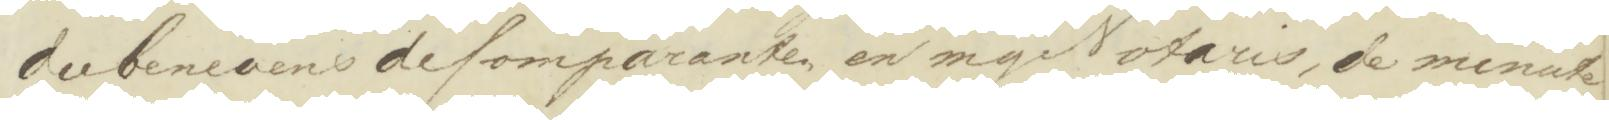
die benevens de Comparanten en my Notaris, de minute
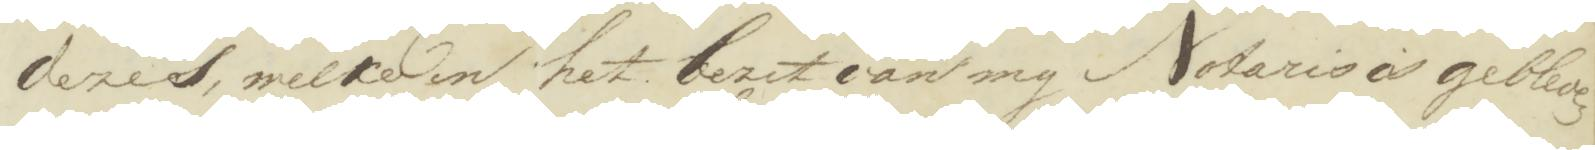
dezes, welke in het bezit van my Notaris is gebleven
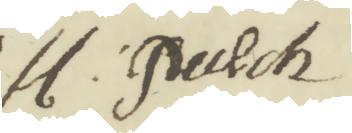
J:H: Pasch
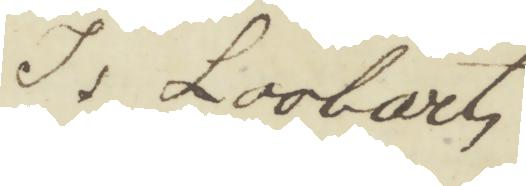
Is Loobart
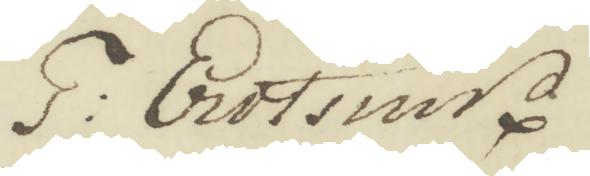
P: Erdtsieck
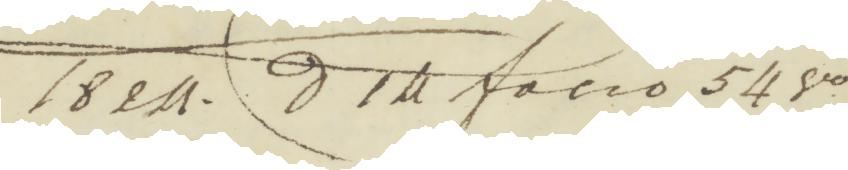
1824. d 14 folio 54 v.o
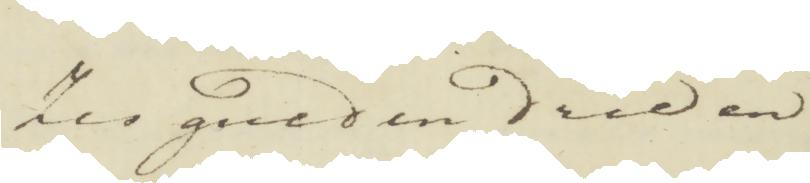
Zes gulden drie en
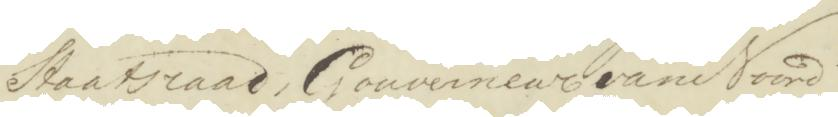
staatsraad, Gouverneur van Noord
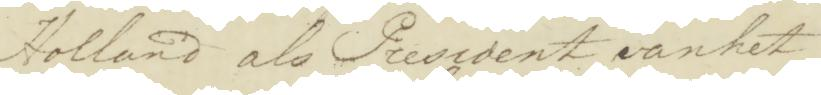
Holland als President van het
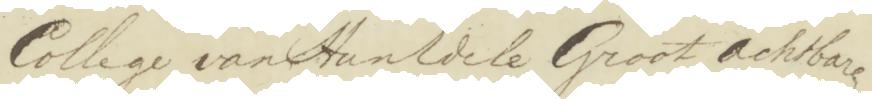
College van Hun Edele Groot achtbare
